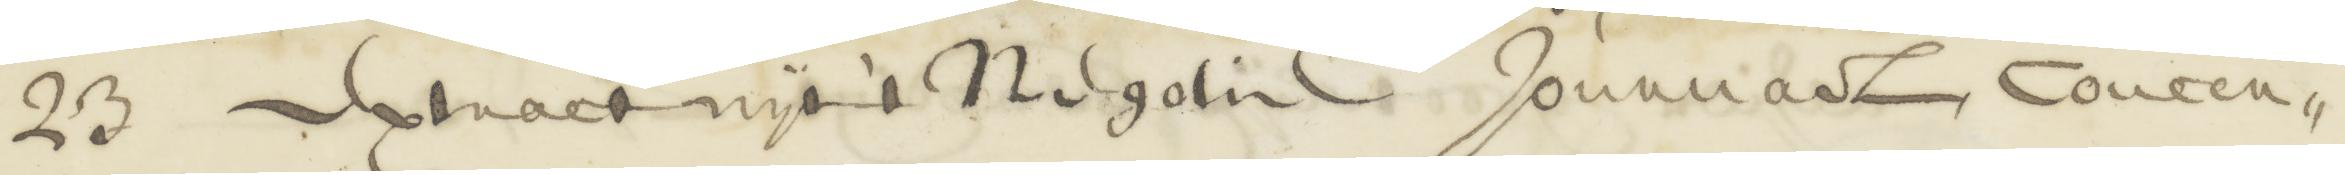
23 extract uijt ’t Negotie Journael concer„
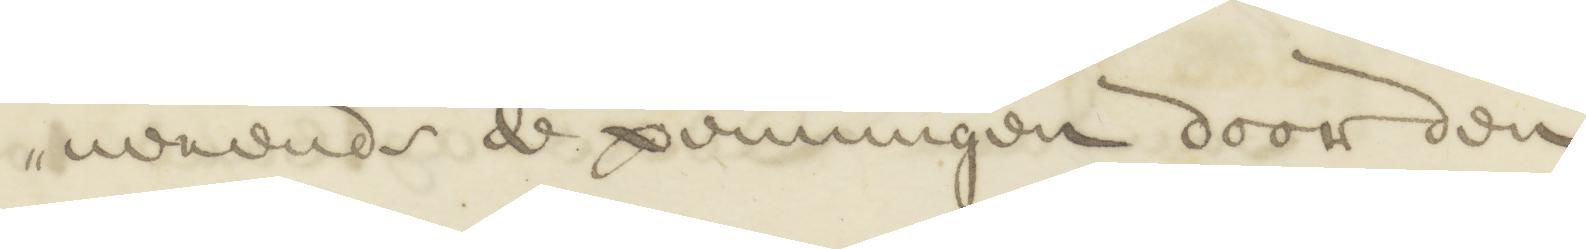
„nerende de penningen door den
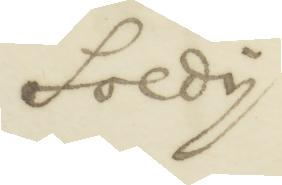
soldij
